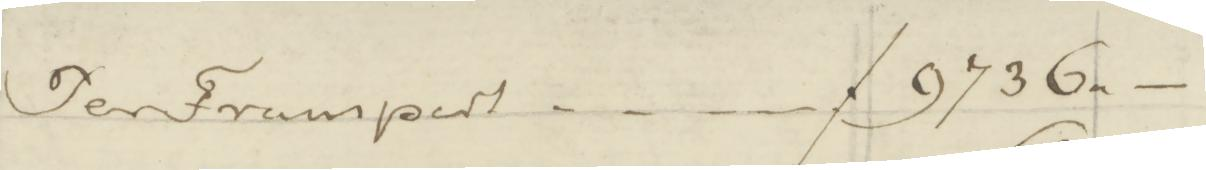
Per Transport – – – – – ƒ 9736„ —
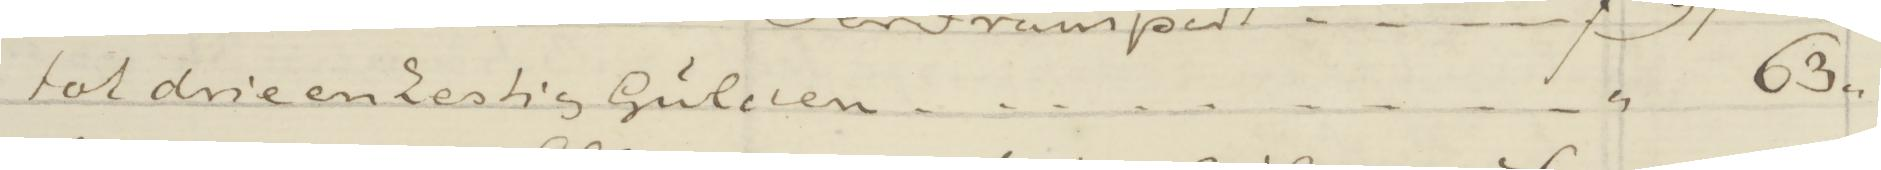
tot drie en zestig Gulden - - - - - - - - - „ 63„
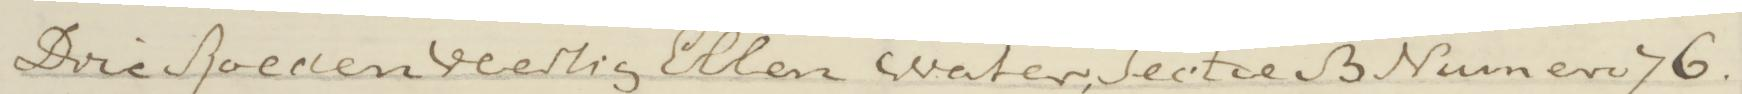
Drie Roeden veertig Ellen water, Sectie B Numero 76
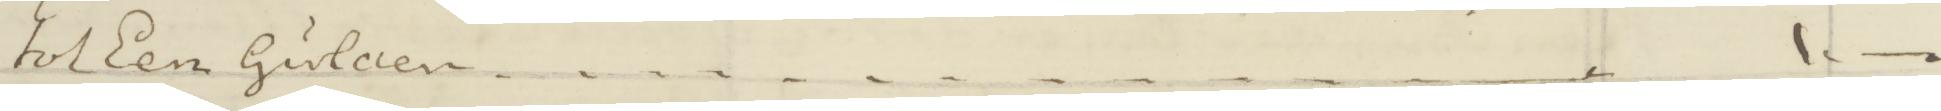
tot Een Gulden - - - - - - - - - - - - „ 1 „ —
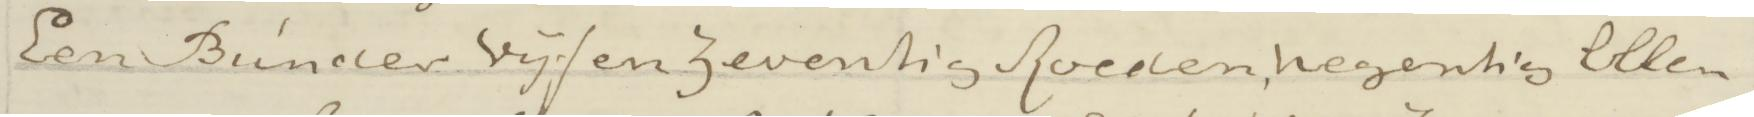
Een Bunder vijf en Zeventig Roeden, negentig Ellen
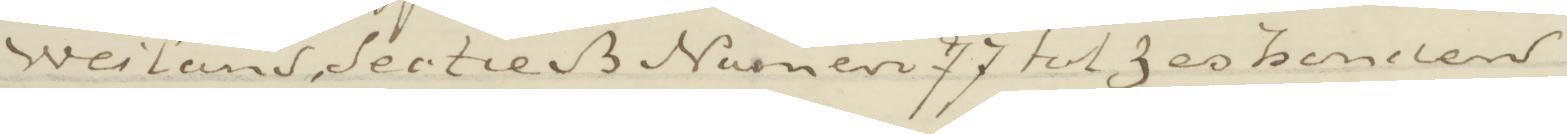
weiland, Sectie B Numero 77 tot zes honderd
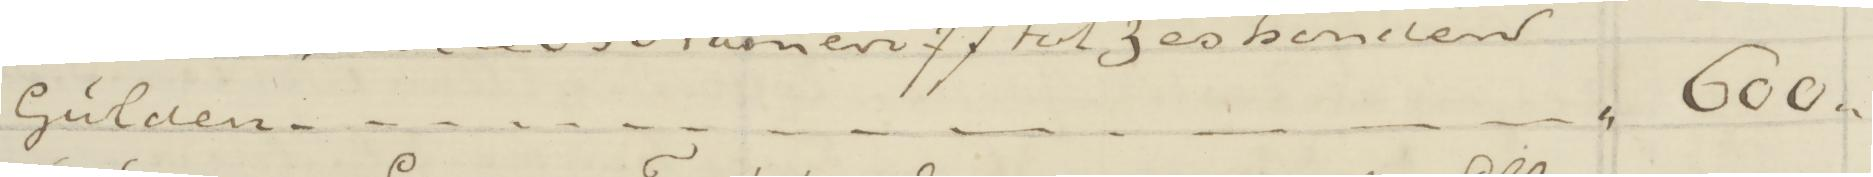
Gulden - - - - - - - - - - - - - - - - - „ 600„
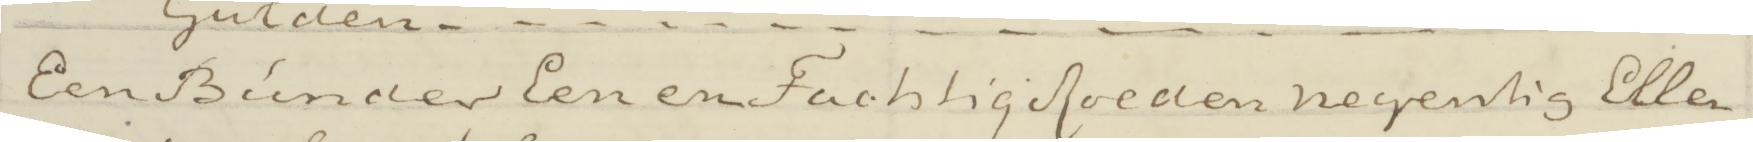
Een Bunder Een en Tachtig Roeden negentig Ellen
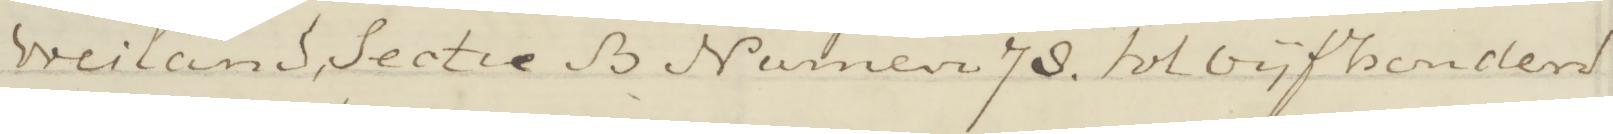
weiland, Sectie B Numero 78. tot vijfhonderd
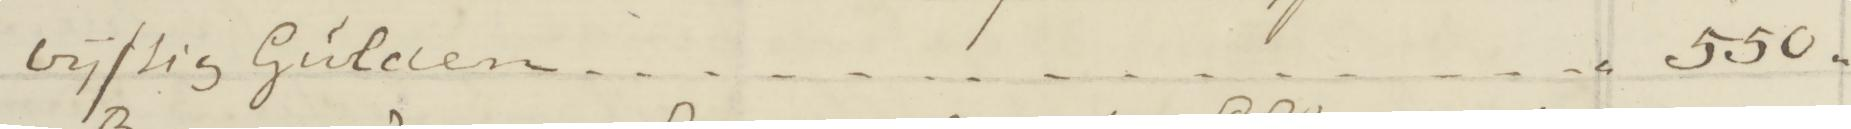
vijftig Gulden - - - - - - - - - - - - - - - „ 550„
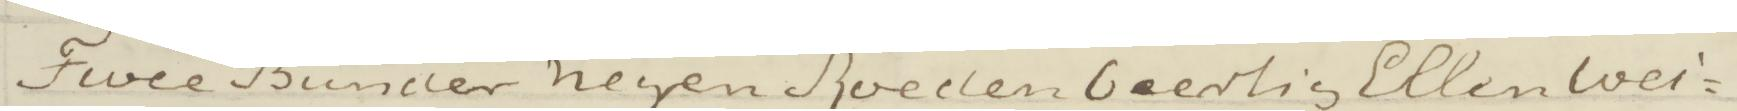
Twee Bunder negen Roeden veertig Ellen Wei=
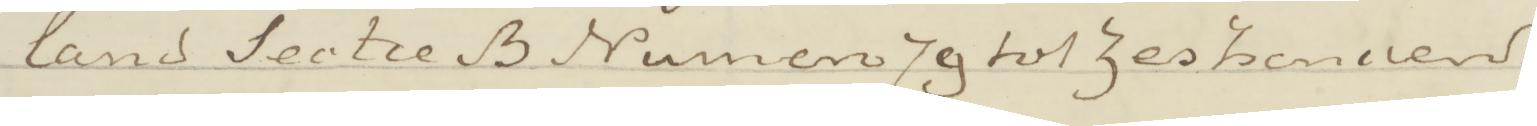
land Sectie B Numero 79 tot Zes honderd
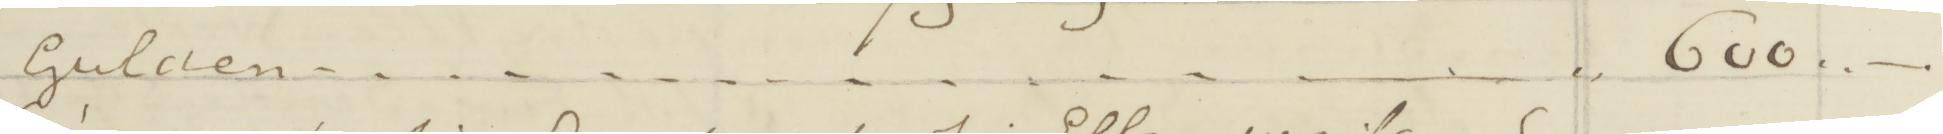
Gulden - - - - - - - - - - - - - - - „ 600 . . —
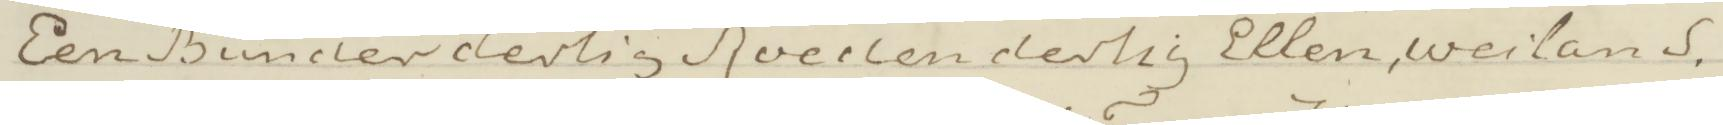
Een Bunder dertig Roeden dertig Ellen, weiland,
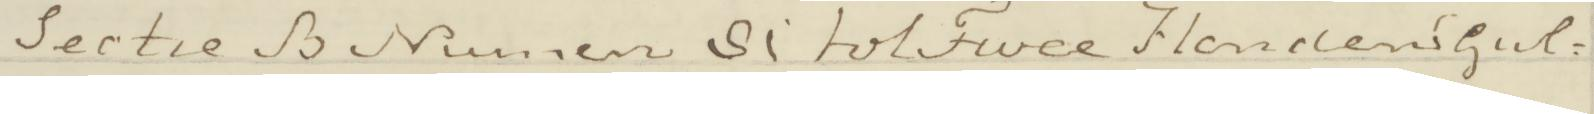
Sectie B Numero 81 tot Twee Honderd Gul=
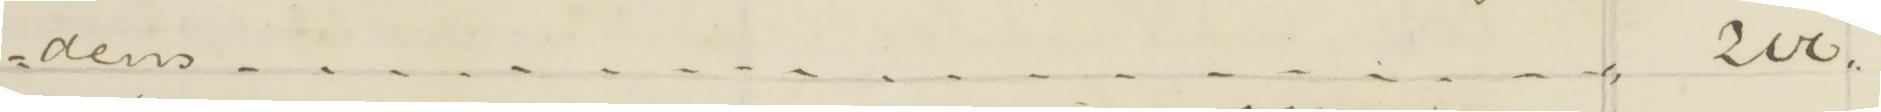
=dens - - - - - - - - - - - - - - - - - - - „ 200„
